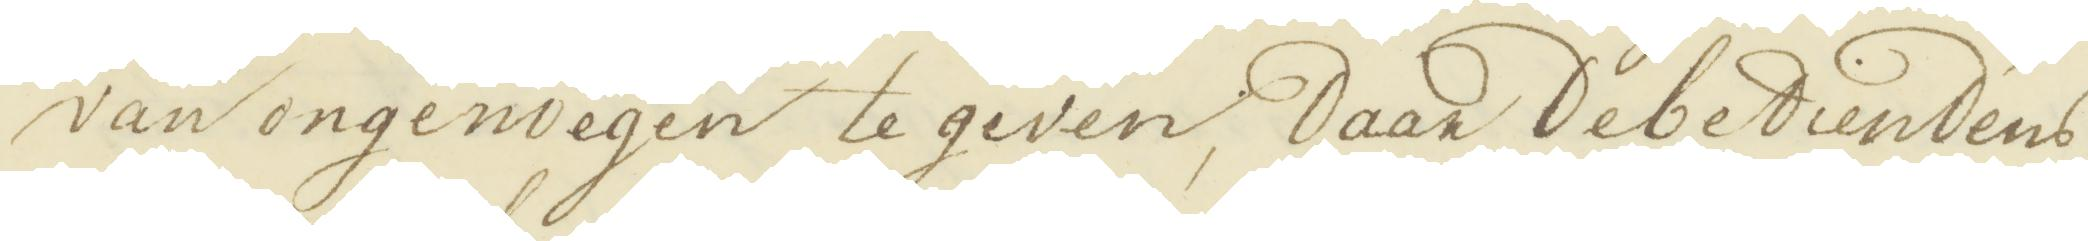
van ongenoegen te geven, daar de bediendens
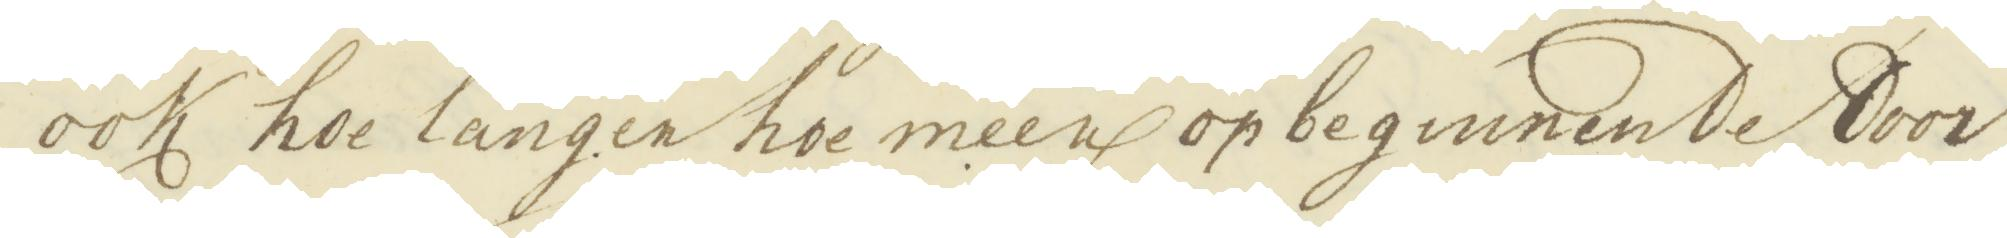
ook hoe langer hoe meer op beginnende door
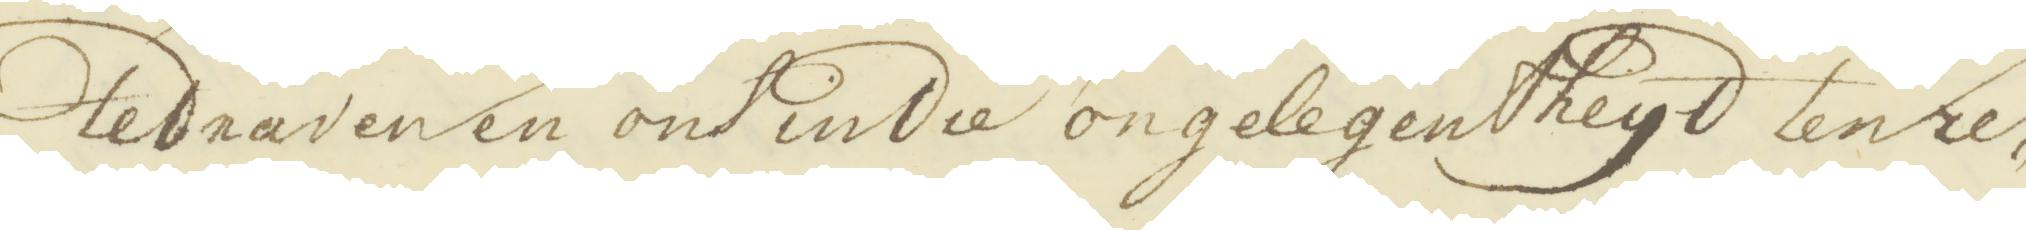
te draven en ons in die ongelegentheyd ten re
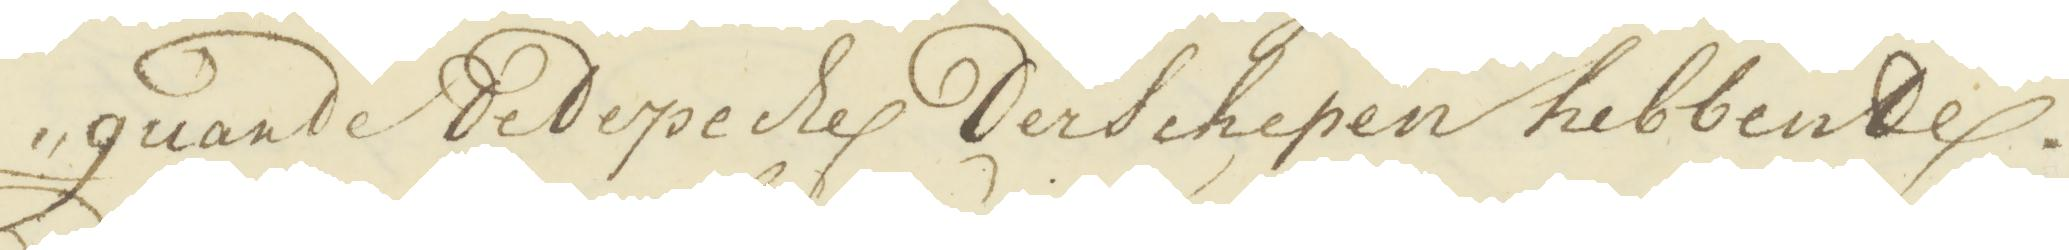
„guarde de depeche der Schepen hebbende
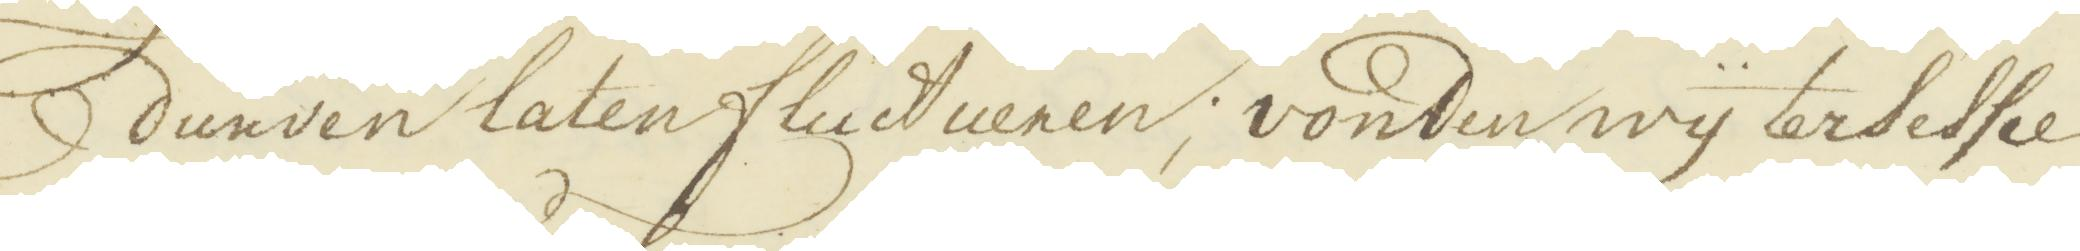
durven laten fluctueren; vonden wij ter sessie
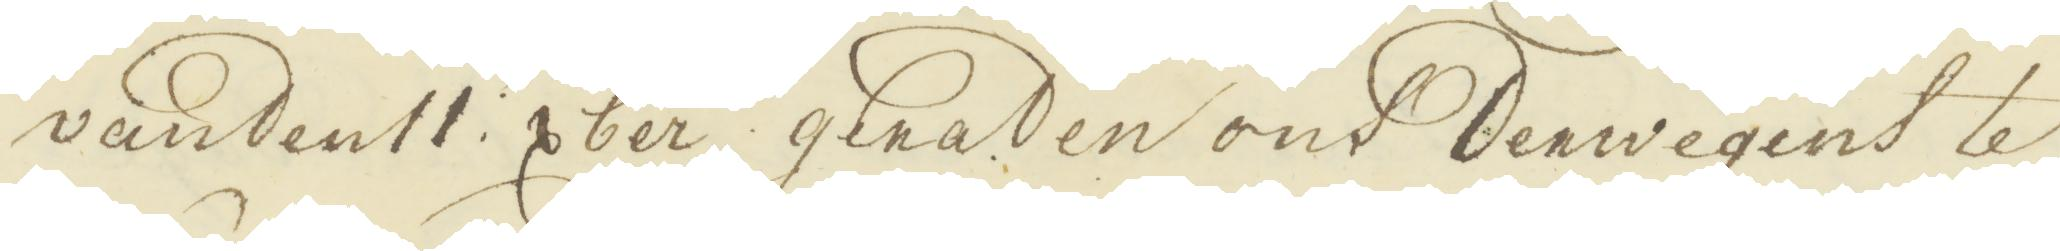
van den 11: xber geraden ons derwegens te
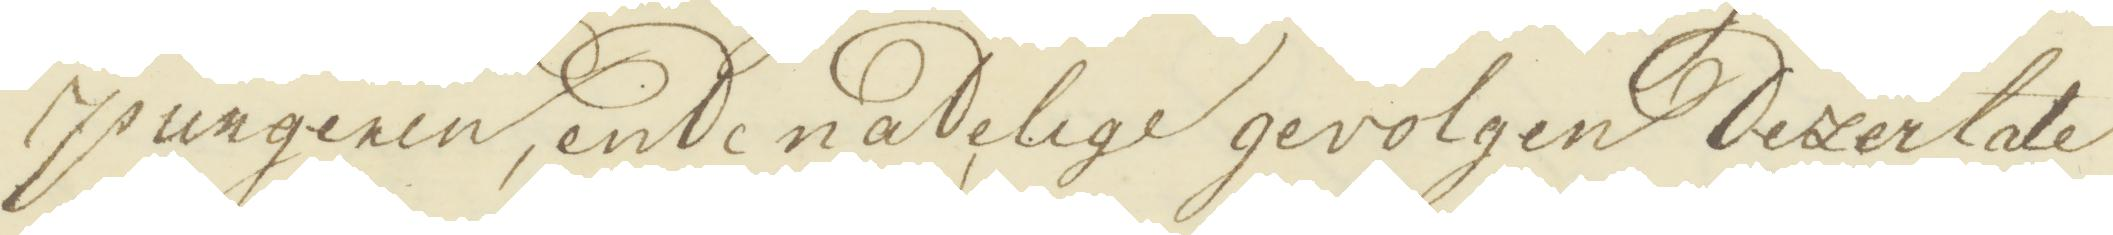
purgeren, en de nadelige gevolgen Dezer late
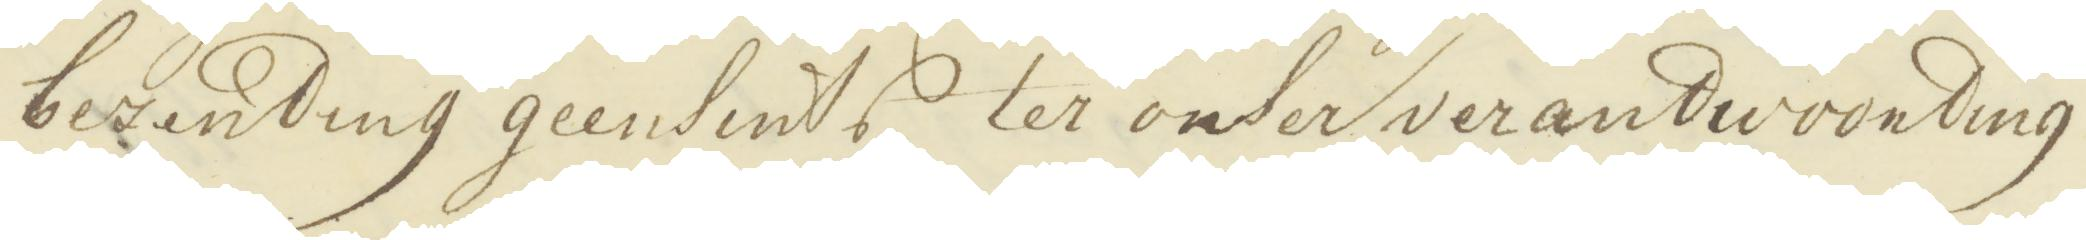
bezending geensints ter onser verandwoording
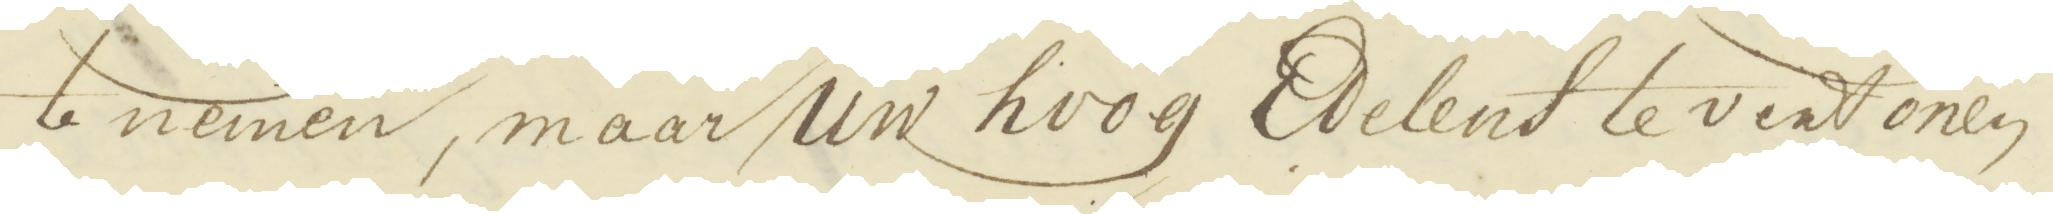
te nemen, maar Uw hoog Edelens te vertonen
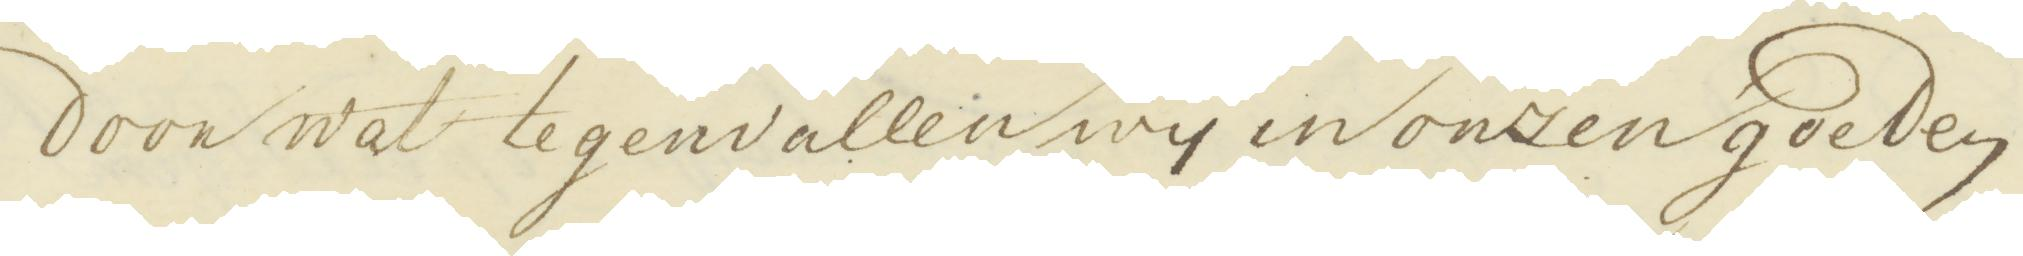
door wat tegenvallen wij in onzen goeden
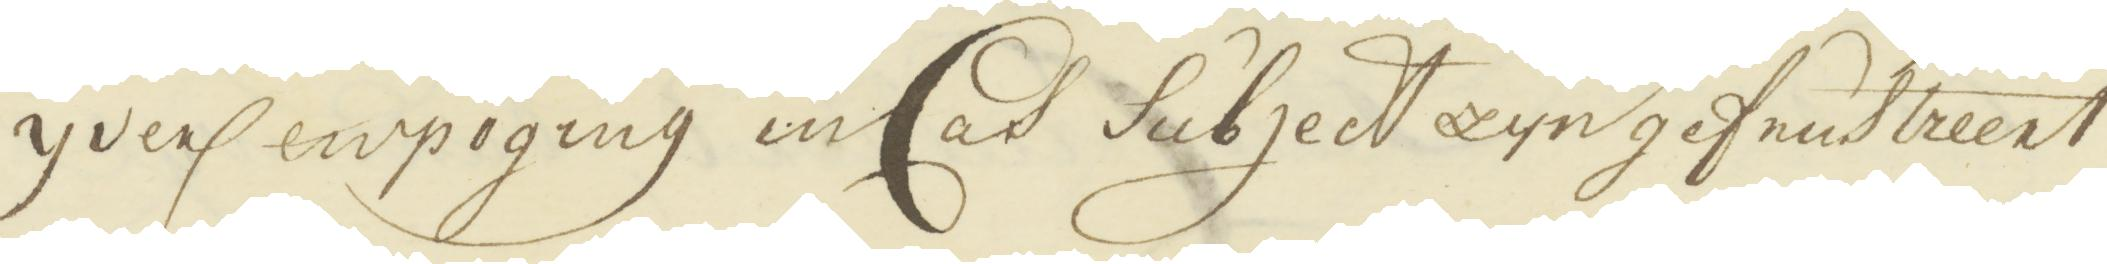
ijver en poging in Cas Subject zijn gefrustreert
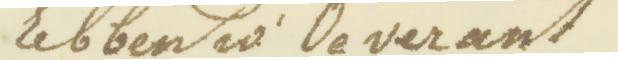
hebben w' de verant
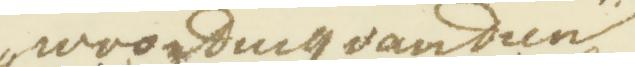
woording van dien
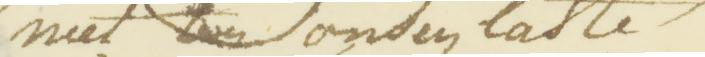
niet ten onsen laste
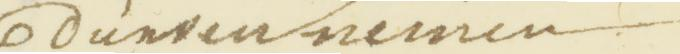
durven nemen
